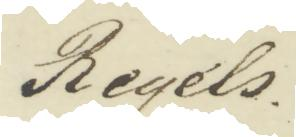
Regels.
